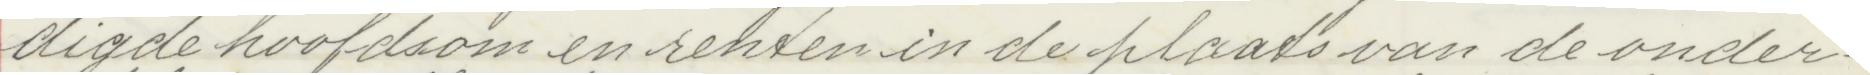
digde hoofdsom en renten in de plaats van de onder-
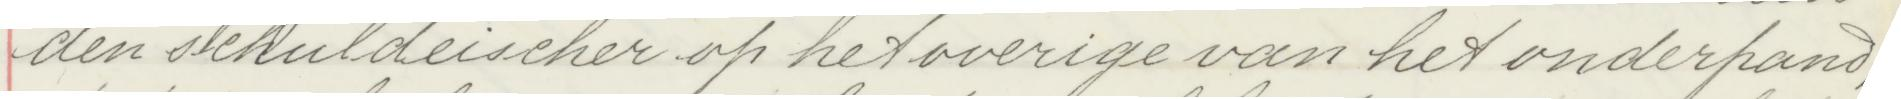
den schuldeischer op het overige van het onderpand;
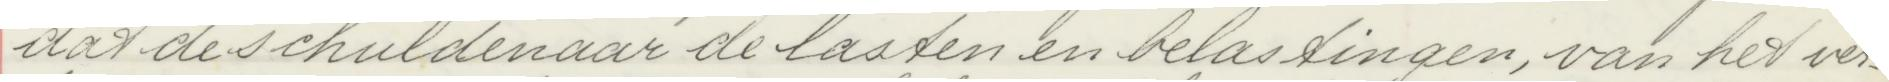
dat de schuldenaar de lasten en belastingen, van het ver-
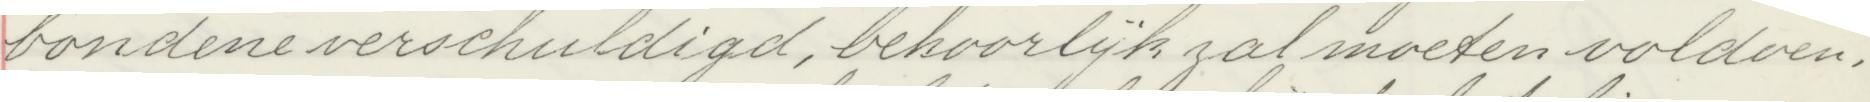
bondene verschuldigd, behoorlijk zal moeten voldoen.
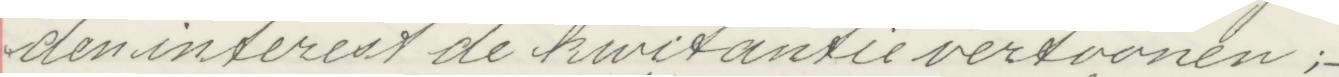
den interest de kwitantie vertoonen;
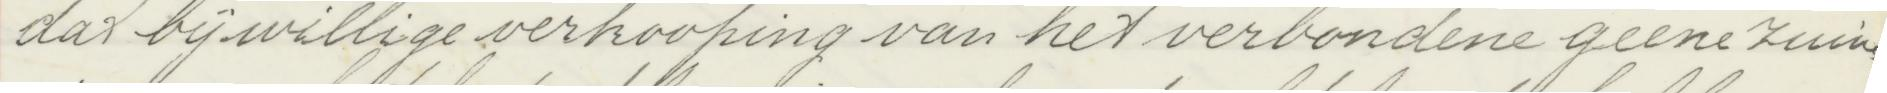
dat bij willige verkooping van het verbondene geene zuive,
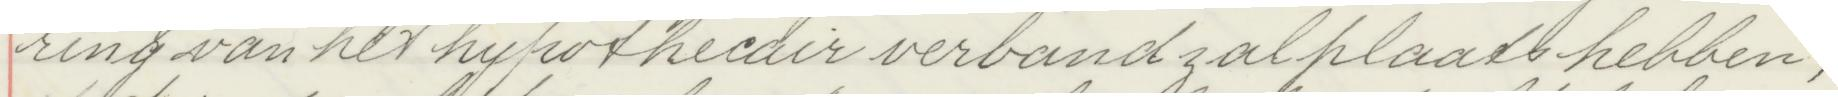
ring van het hypothecair verband zal plaats hebben;
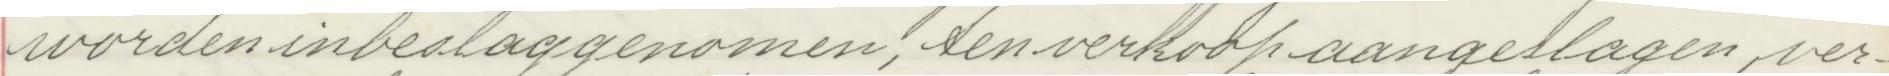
worden inbeslaggenomen, ten verkoop aangeslagen, ver-
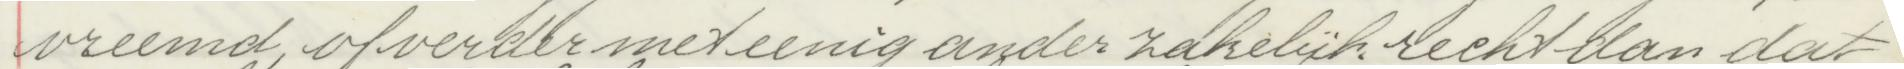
vreemd, of verder met eenig ander zakelijk recht dan dat
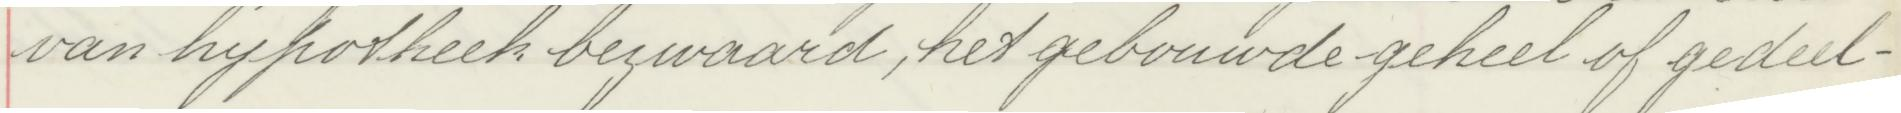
van hypotheek bezwaard, het gebouwde geheel of gedeel-
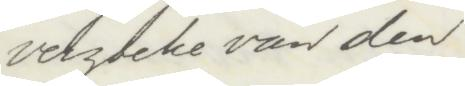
verzoeke van den
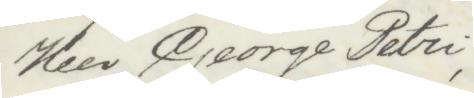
Heer George Petri,
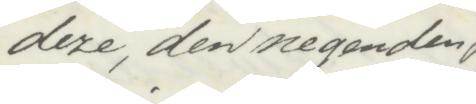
deze, den negenden
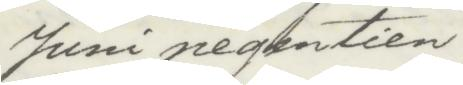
Juni negentien
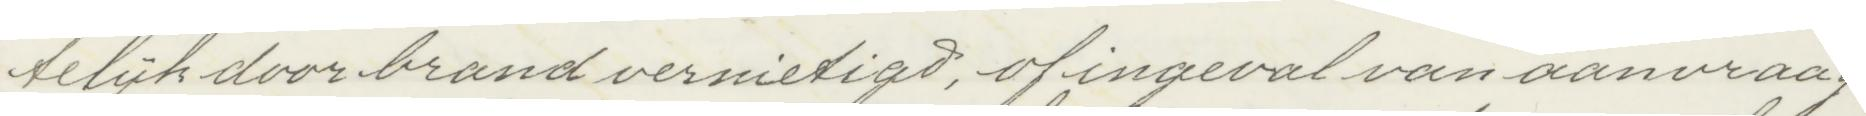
telijk door brand vernietigd, of ingeval van aanvraag
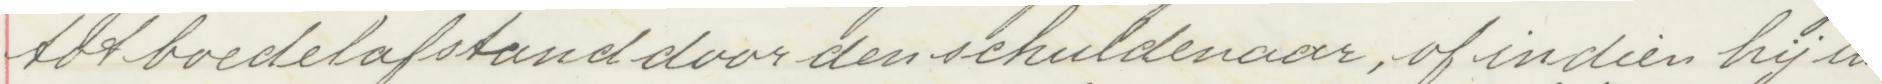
tot boedelafstand door den schuldenaar, of indien hij in
